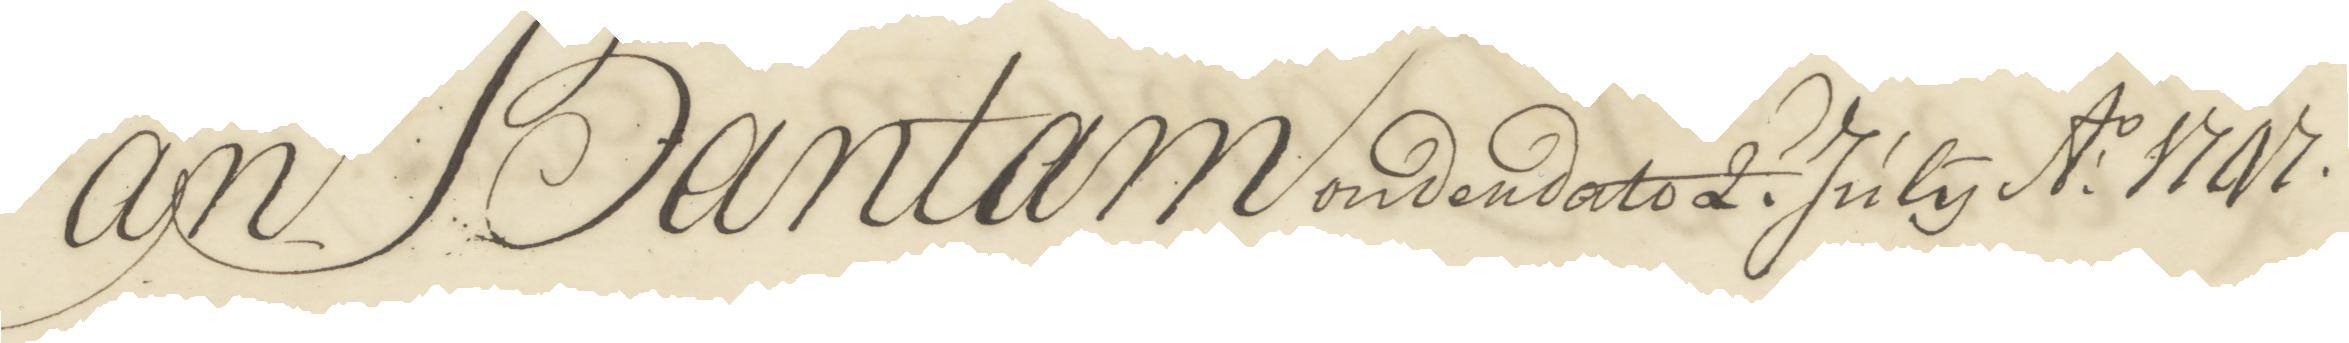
Van Bantam onder dato 2.' Julij A:o 1747.
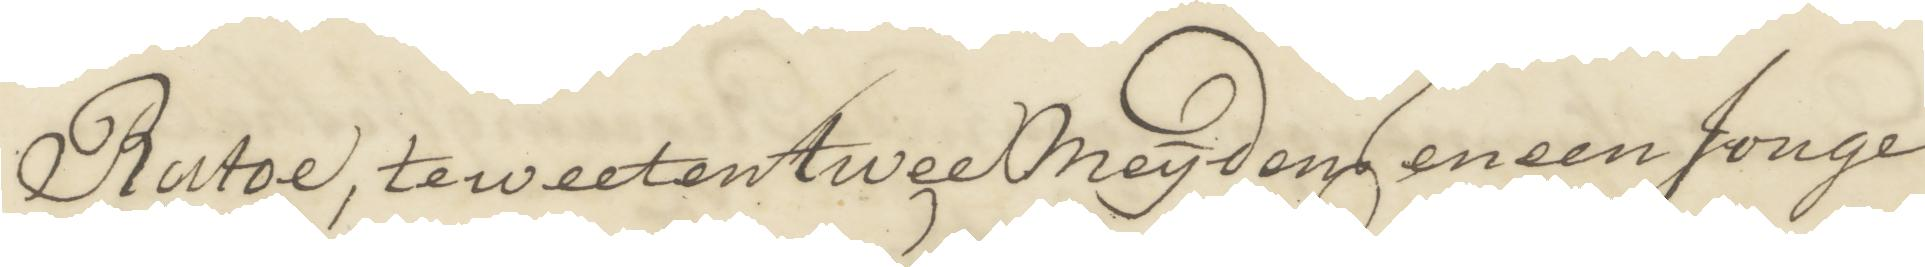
Ratoe, te weeten twee meijdens en een jonge
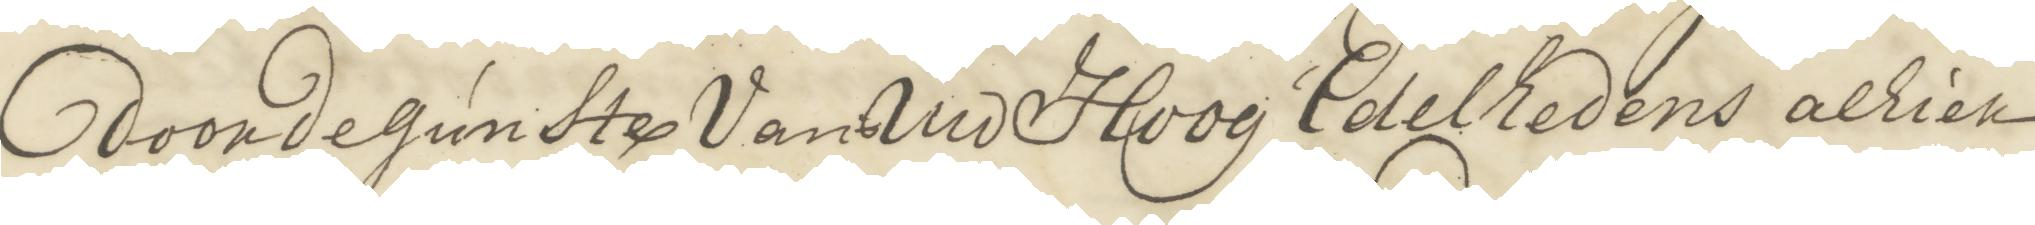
door de gunste van uw Hoog Edelhedens alhier
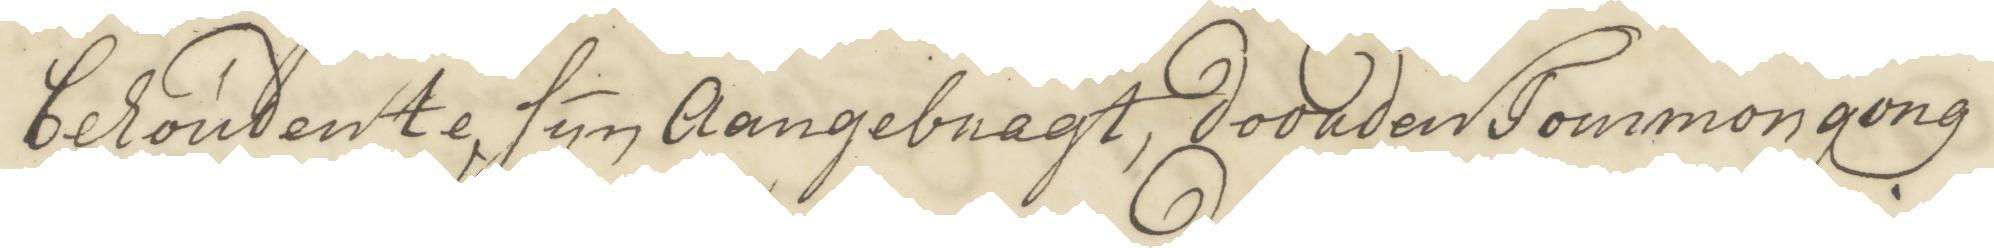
behouden te sijn aangebragt, door den Tommongong
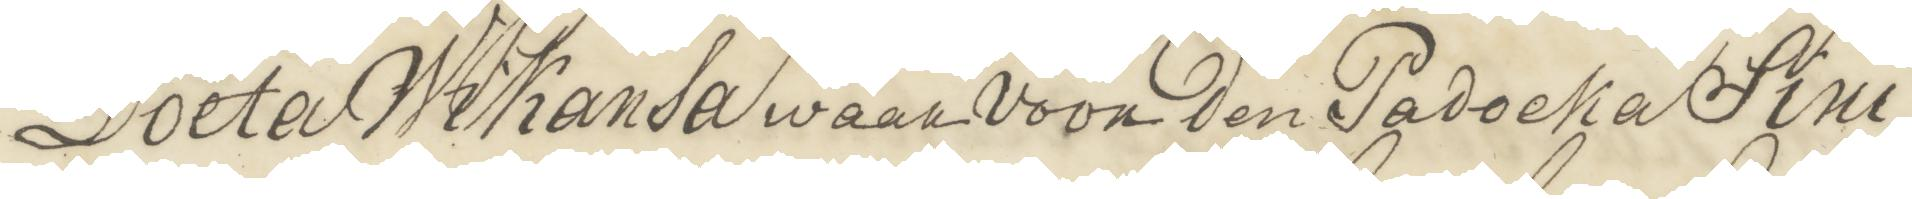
Doeta Wikansa waar voor den Padoeka Siri
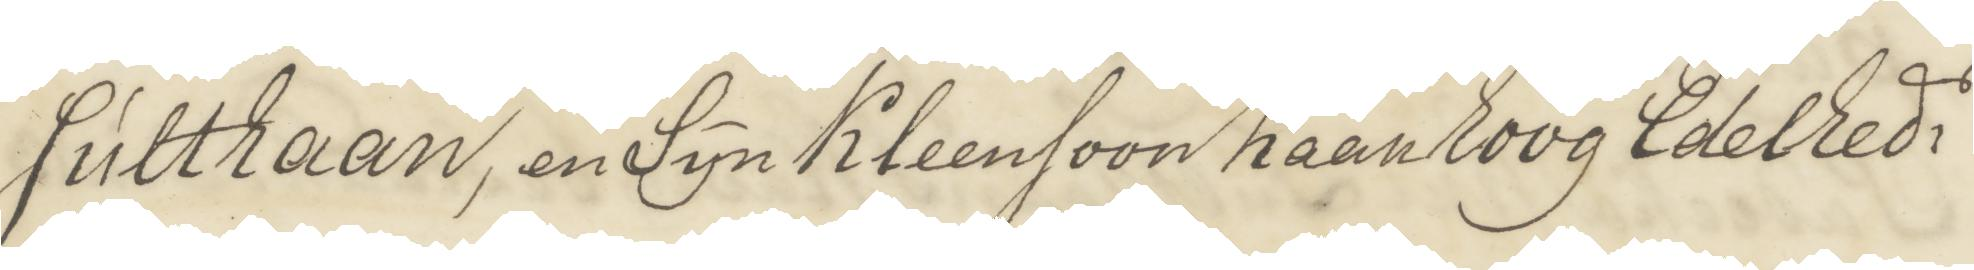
sulthaan, en sijn kleensoon haar hoog Edelhed:
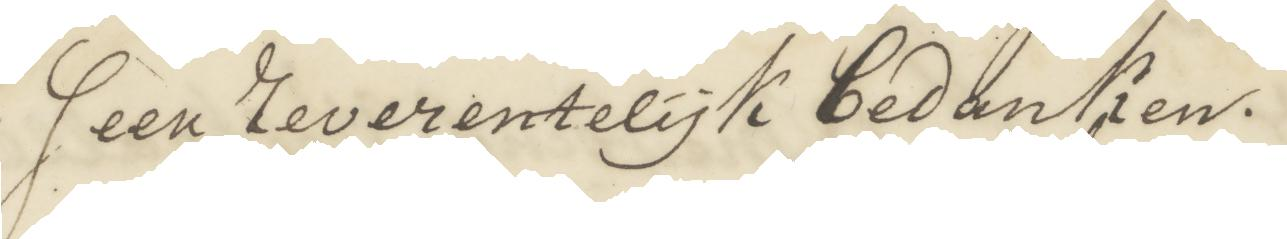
seer reverentelijk bedanken.
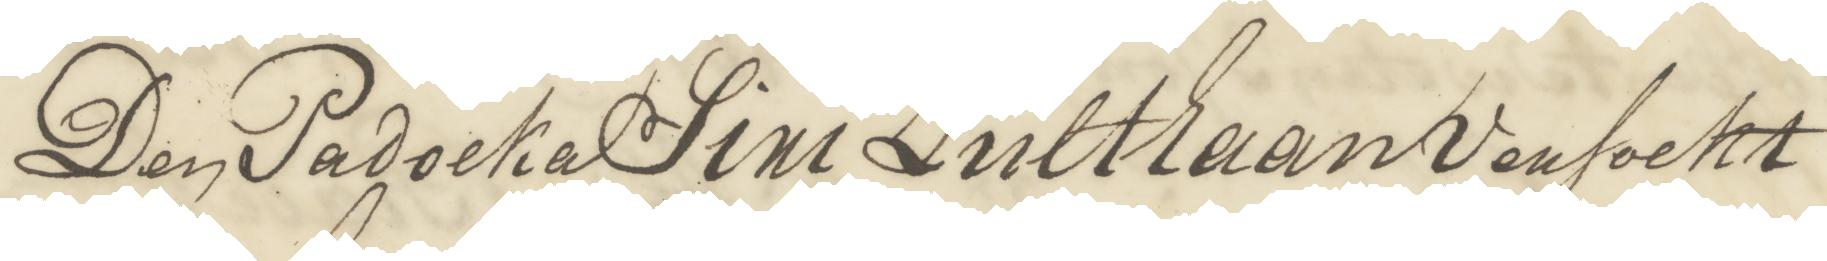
Den Padoeka Siri Zulthaan versoekt
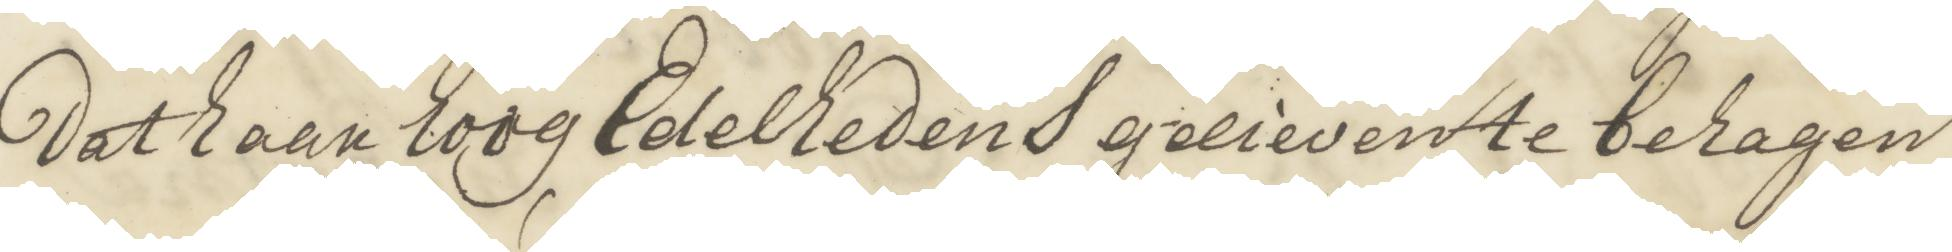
dat haar hoog Edelhedens gelieven te behagen
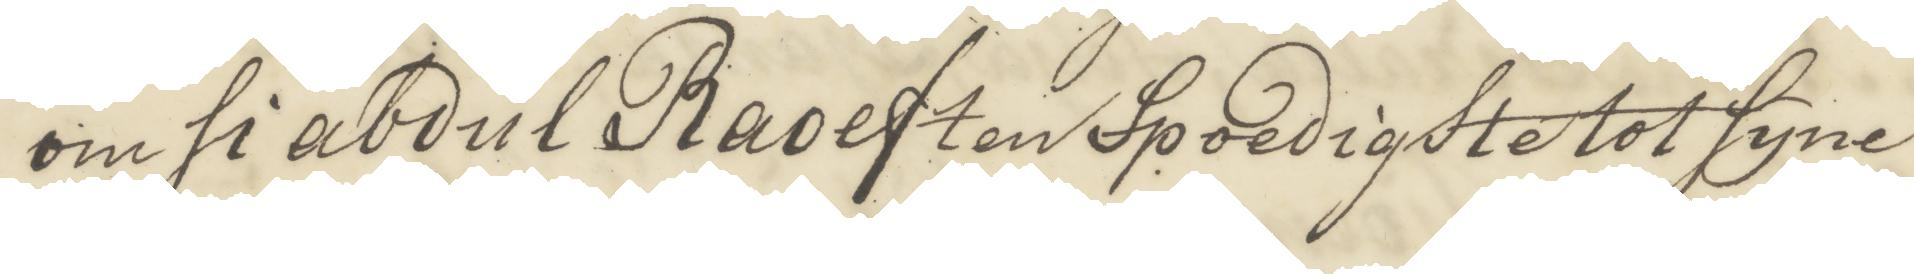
om si abdul Raoef ten spoedigste tot sijne
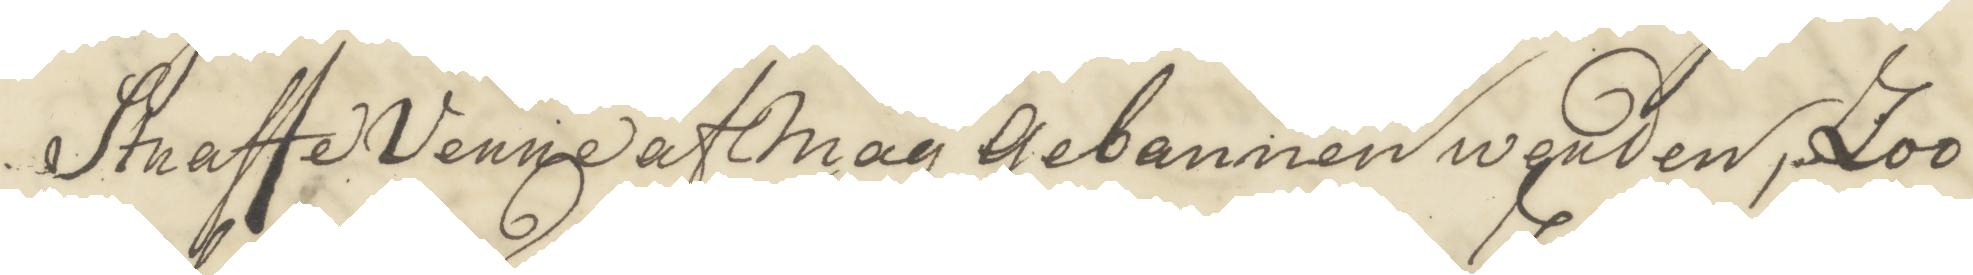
straffe verre af mag gebannen werden, zoo
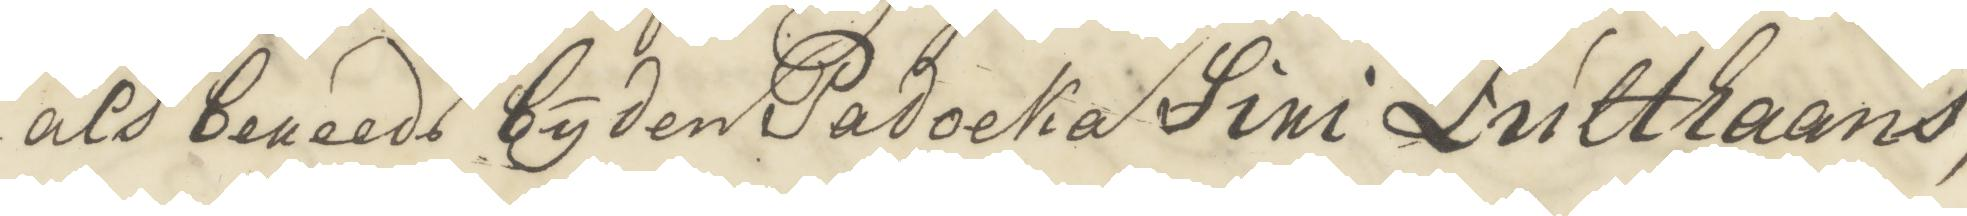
als bereeds bij den Padoeka Siri Zulthaans,
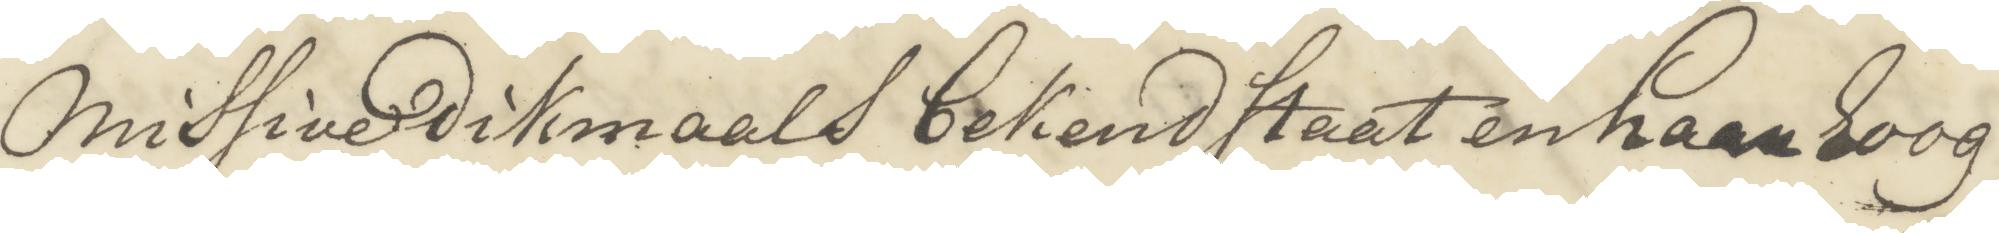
missive dikmaals bekend staat en haar hoog
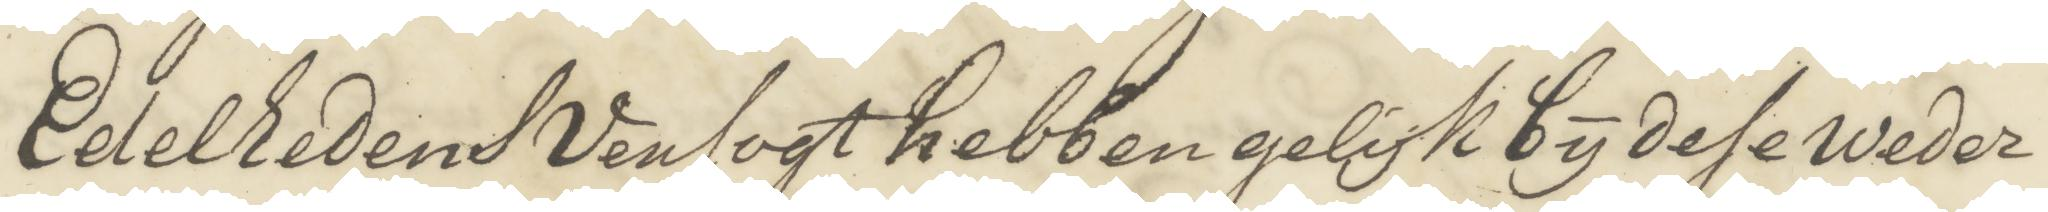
Edelhedens versogt hebben gelijk bij dese weder
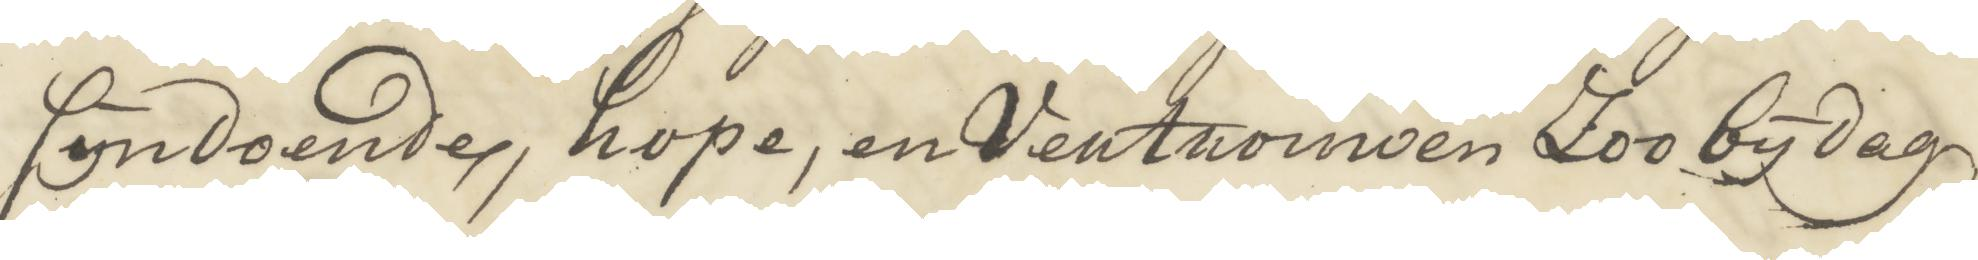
sijn doende, hope, en vertrouwen zoo bij dag
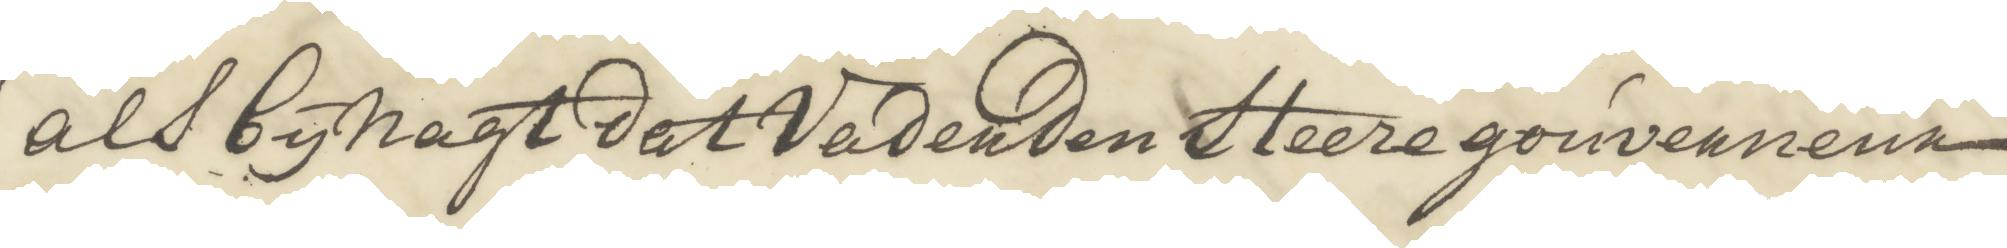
als bij nagt dat vader den Heere gouverneur
